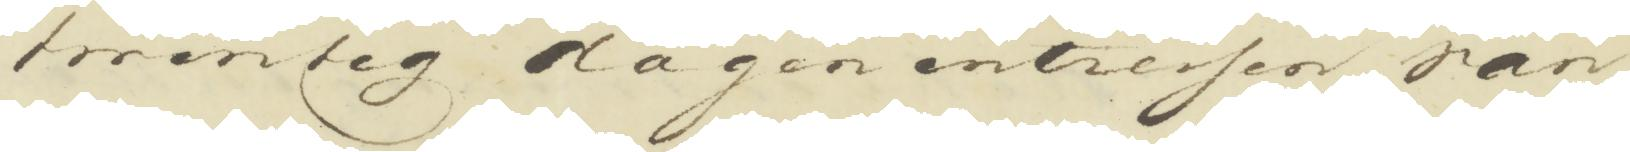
twintig dagen intressen van
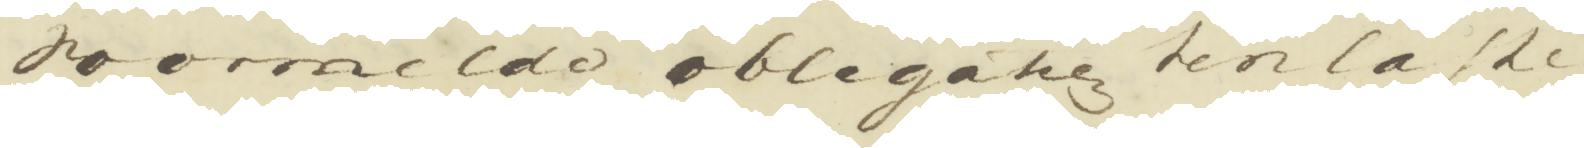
voormelde obligatie ten laste
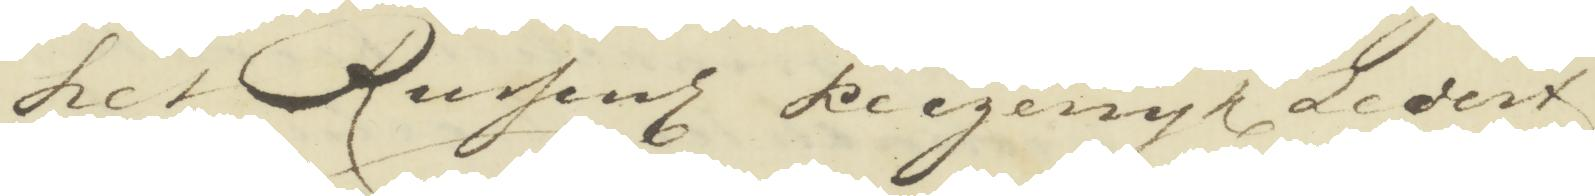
het Russens keizerryk zedert
